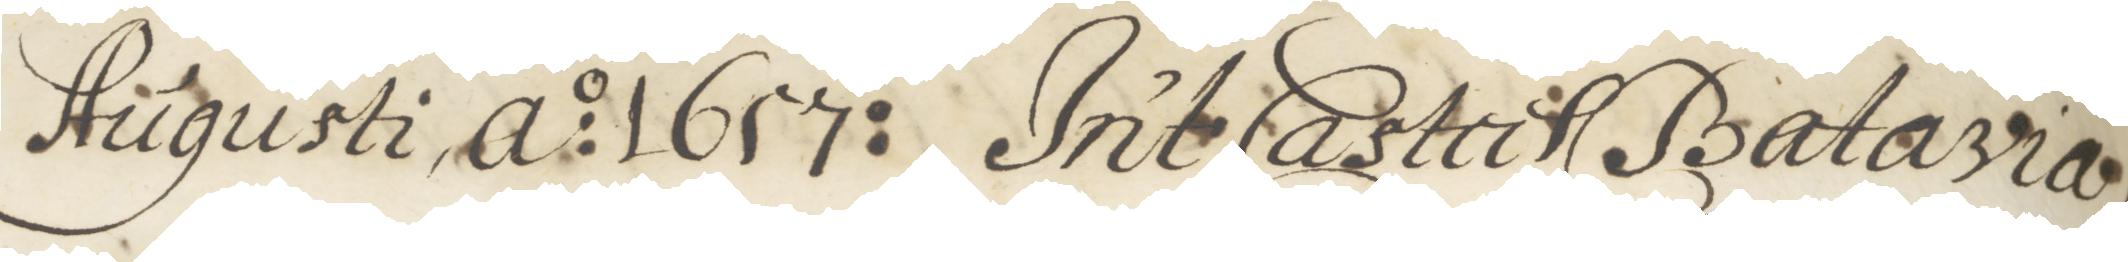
Augusti, a:o 1657: In 't Casteel Batavia
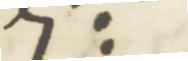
7:en
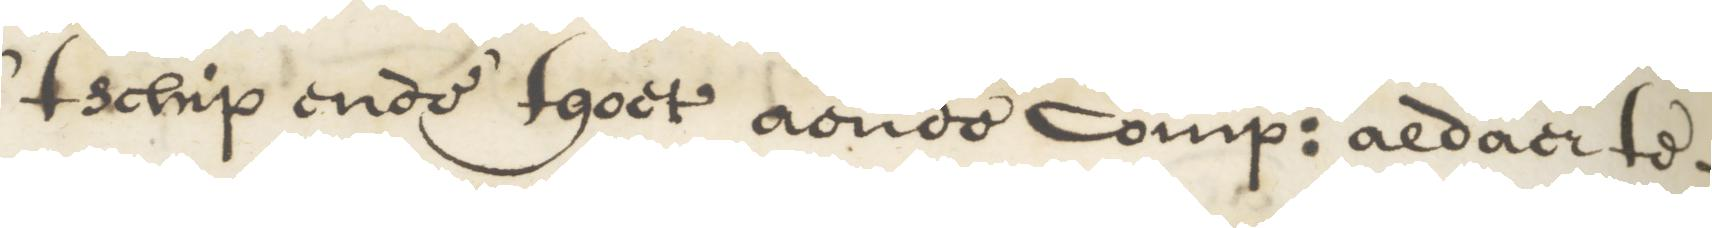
’t schip ende ’t goet aende comp:e aldaer te
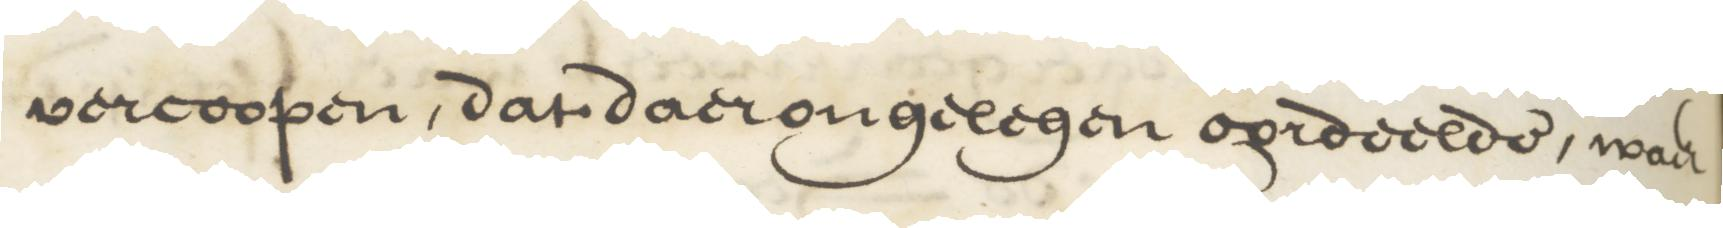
vercoopen, dat daer ongelegen oordeelde, waer
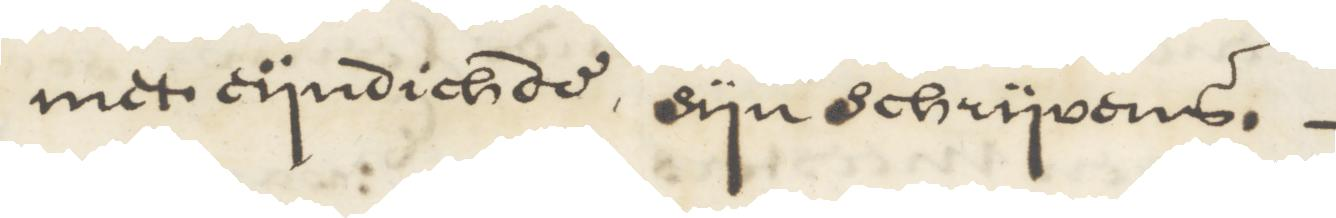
met eijndichde, sijn schrijvens.
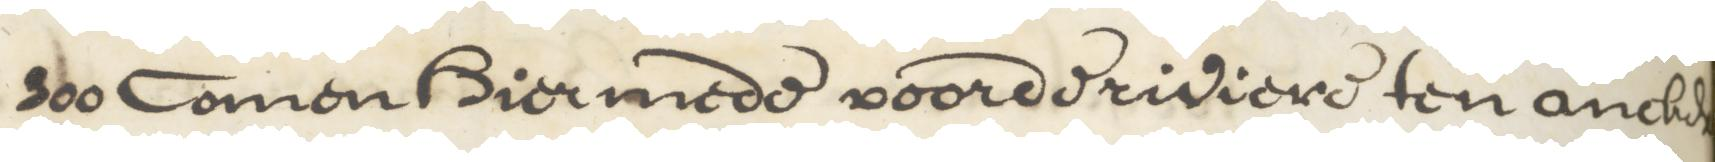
soo comen hier mede voor de riviere ten ancker
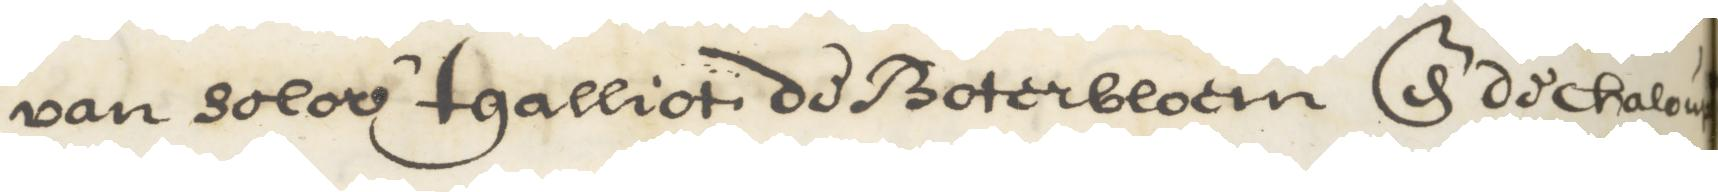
van solor ’t galliot de Boterbloem ende de chaloup
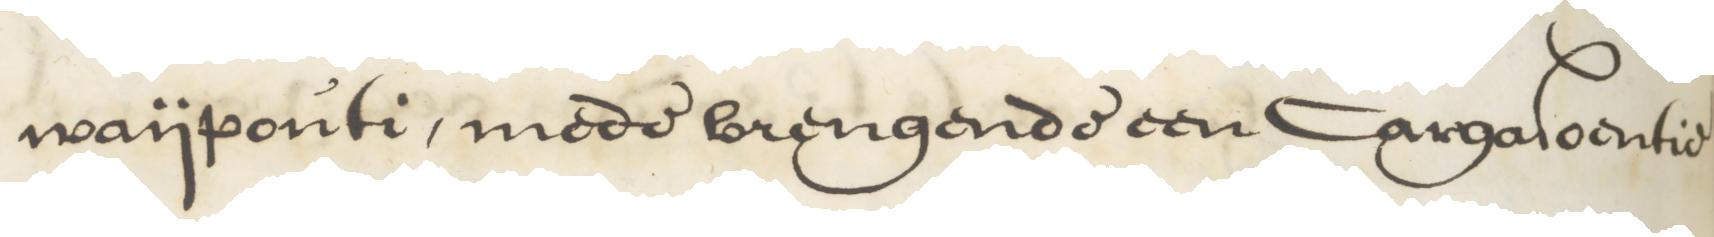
waijpouti, mede brengende een cargasoentie
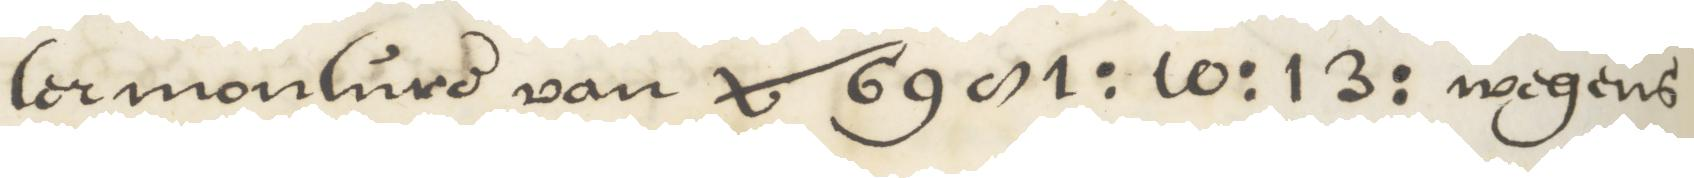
ter monture van ƒ 6981: 10: 13: wegens
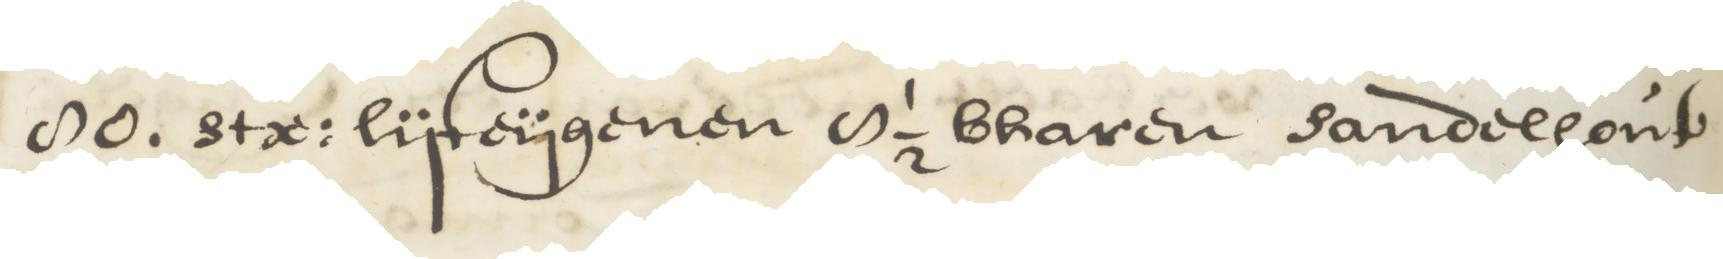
80. stx: lijfeijgenen 8½ bharen sandelhout
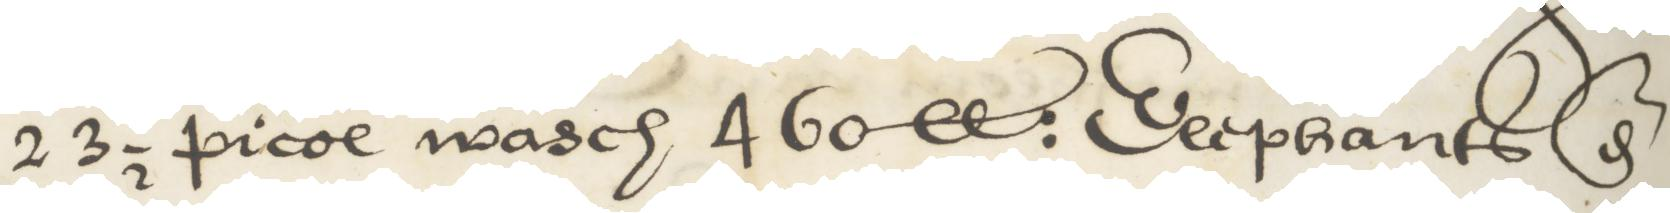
23½ picol wasch 460 lb: Elephants ende
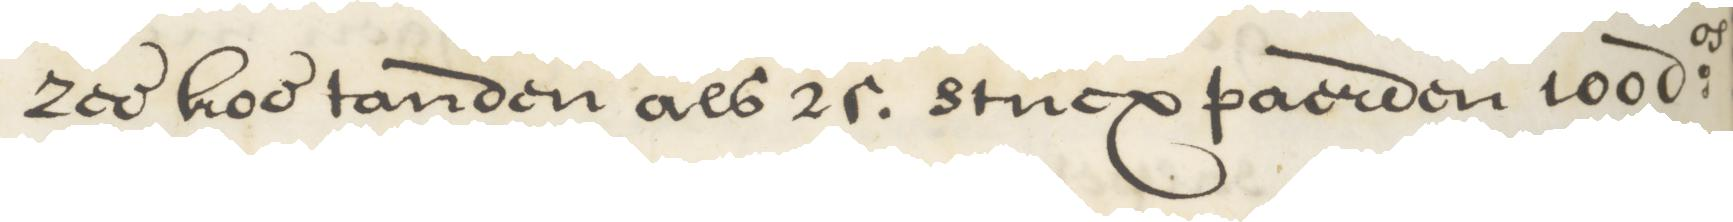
zee koe tanden als 25. stucx paerden 100 d:os
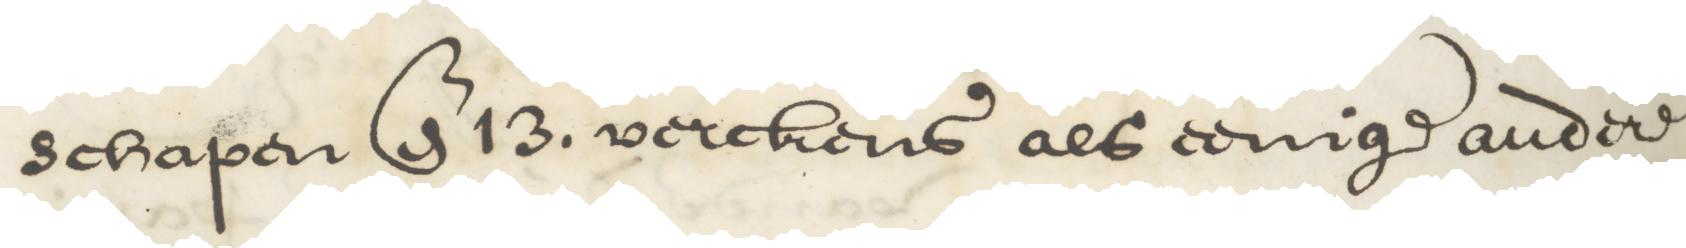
schapen ende 13. verckens als eenige andere
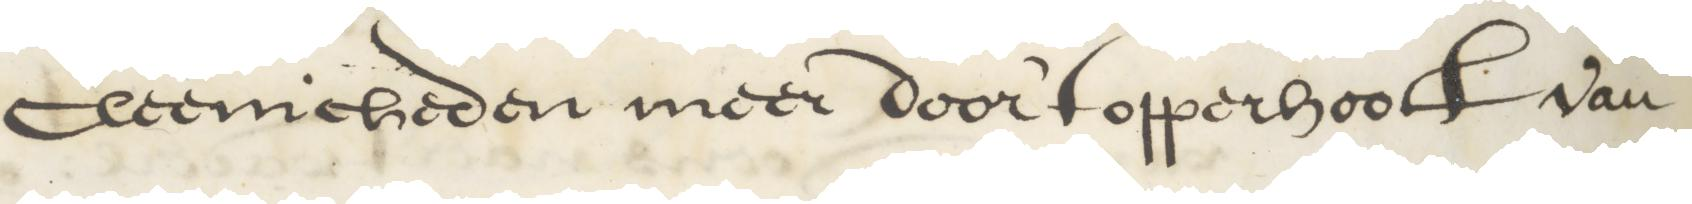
cleenicheden meer door ’t opperhooft van
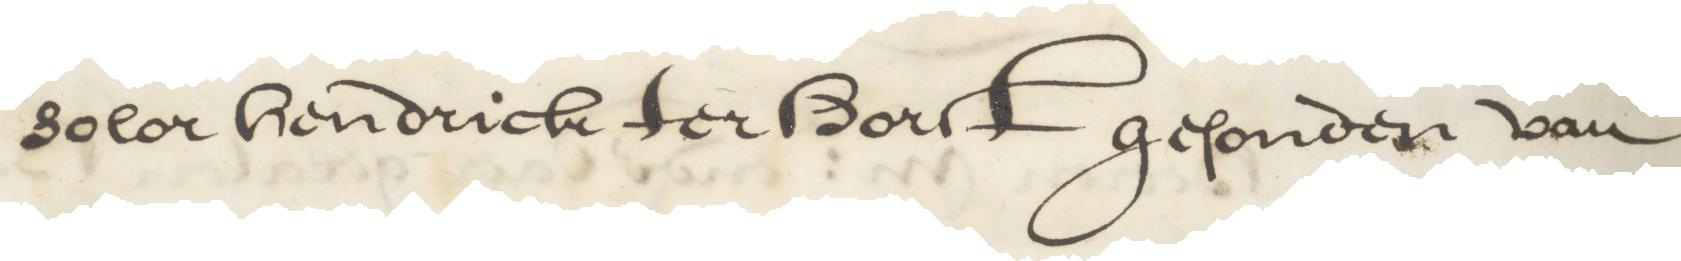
solor hendrick ter Horst gesonden van
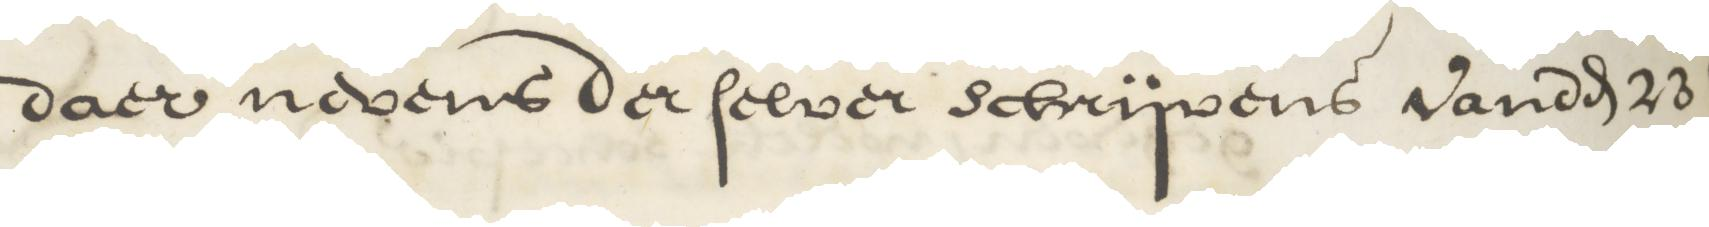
daer nevens der selver schrijvens van den 23e
